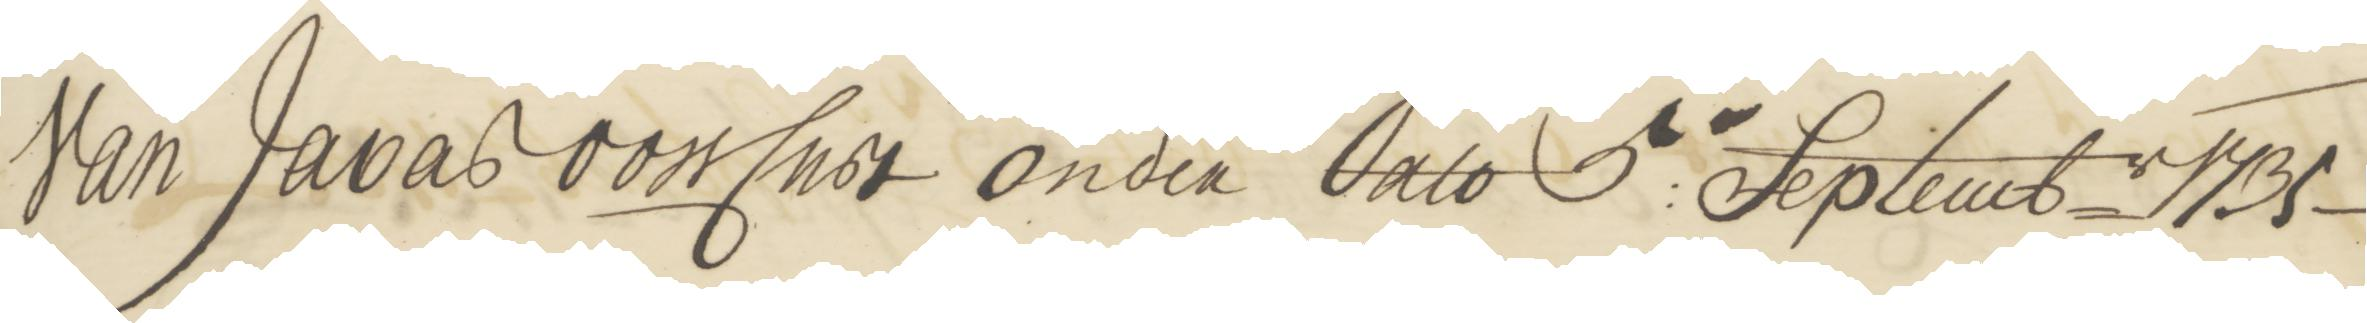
Van Javas oostCust onder dato 5:' Septemb=r 1735 —
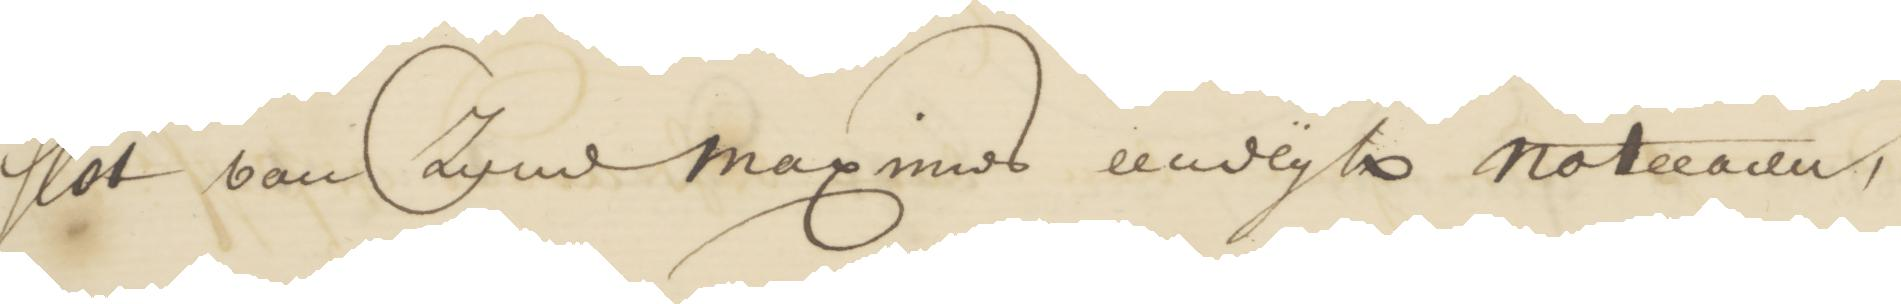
slot van zijne maximes eenelijk noteeren,
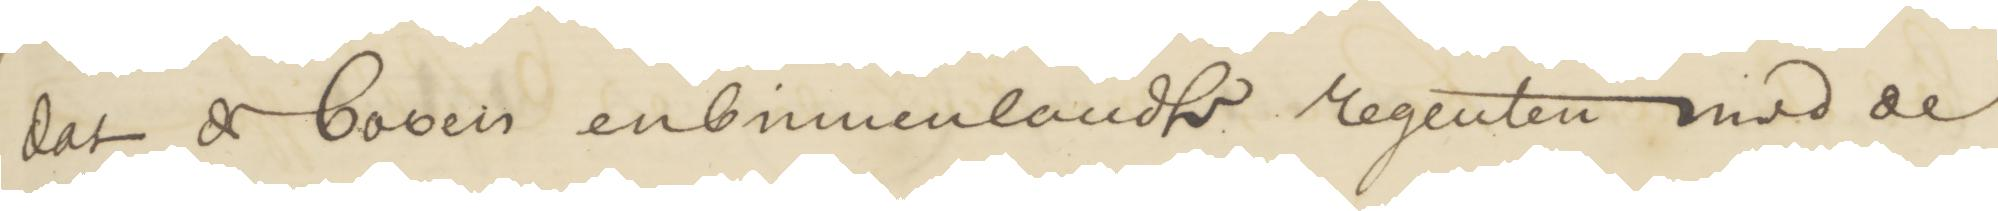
dat de boven enbinnenlandse regenten med de
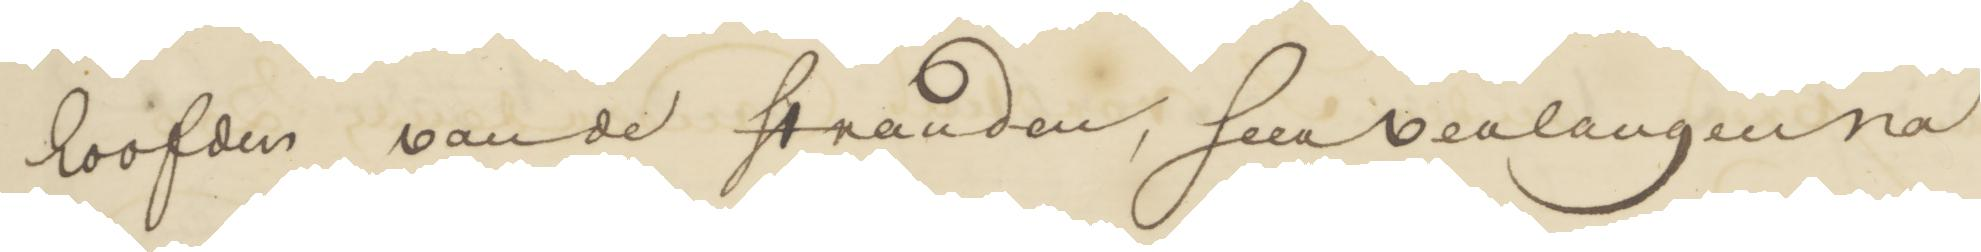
hoofden van de stranden, seer verlangen na
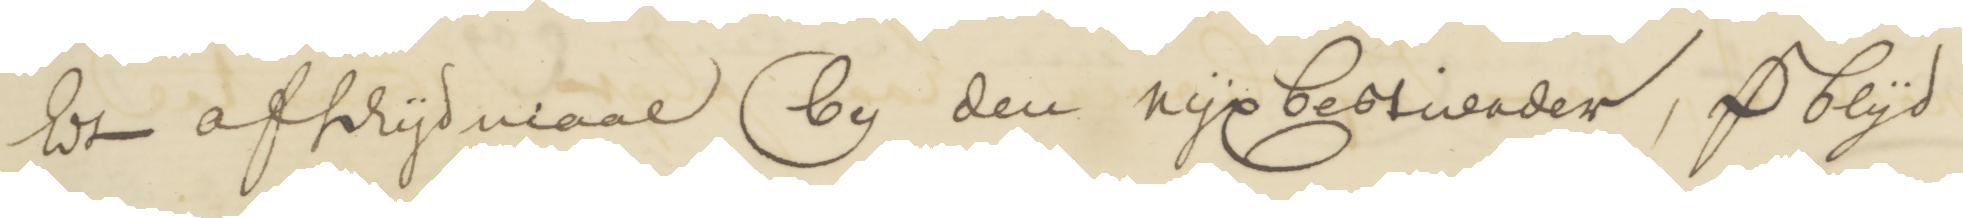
het afschijdmaal bij den rijxbestierder, verblijd
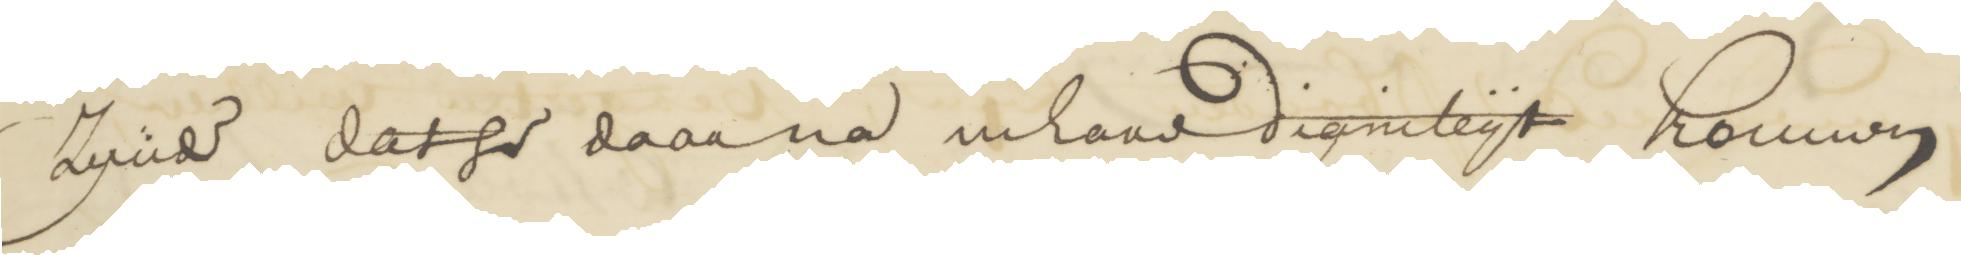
zijnde datse daarna inhare digniteijt konnen
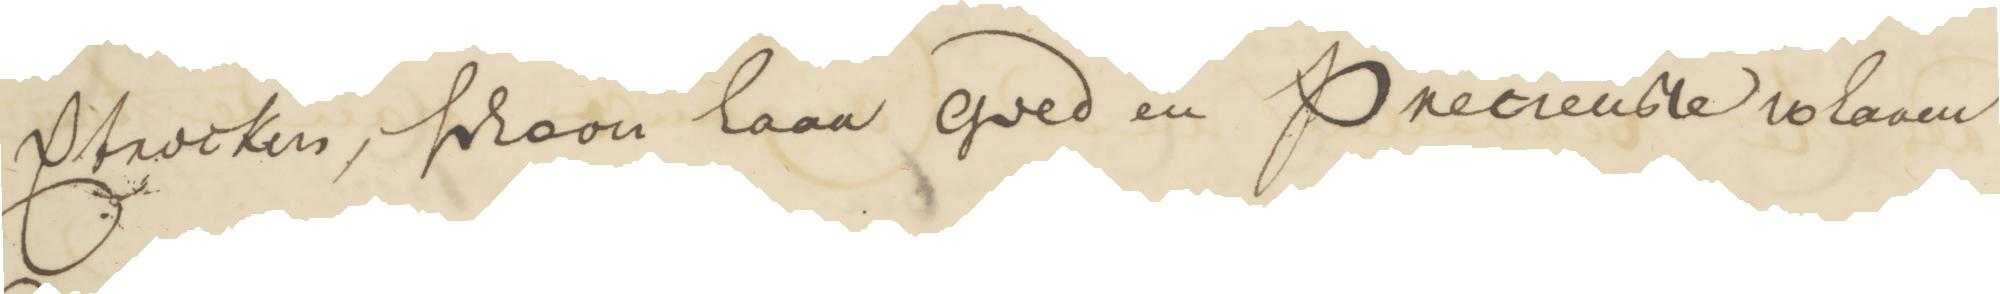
vertrecken, schoon haar geld en precieuse wharen
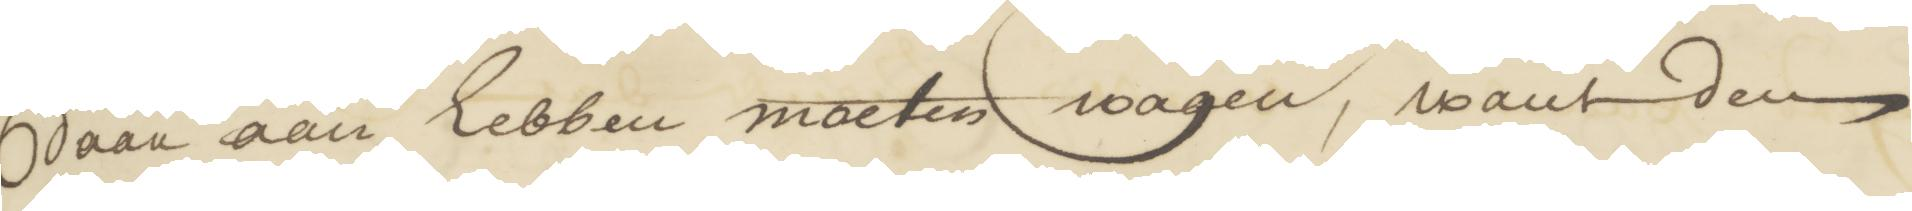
daar aan hebben moeten wagen, want den
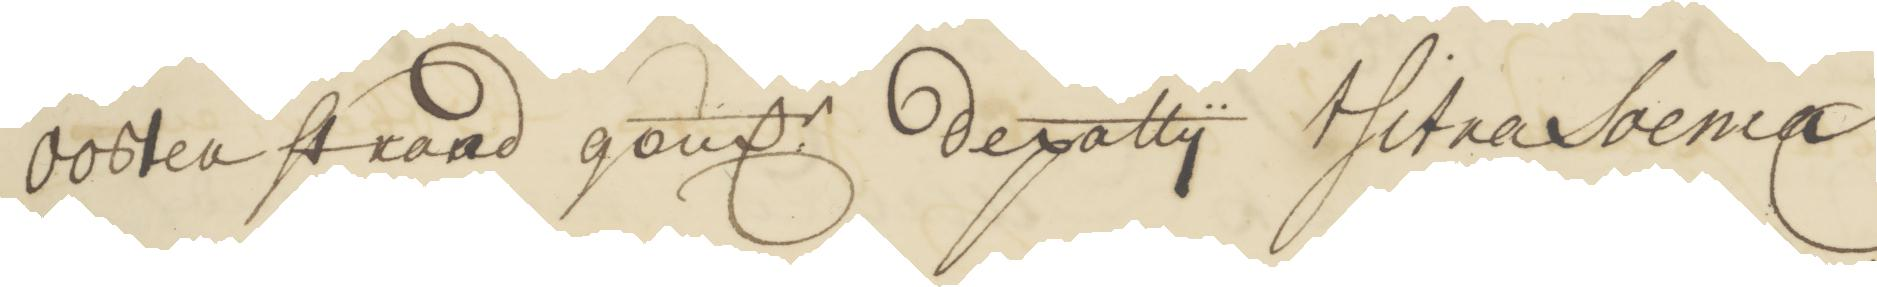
ooster strand gouver:r depattij tsitrasoema
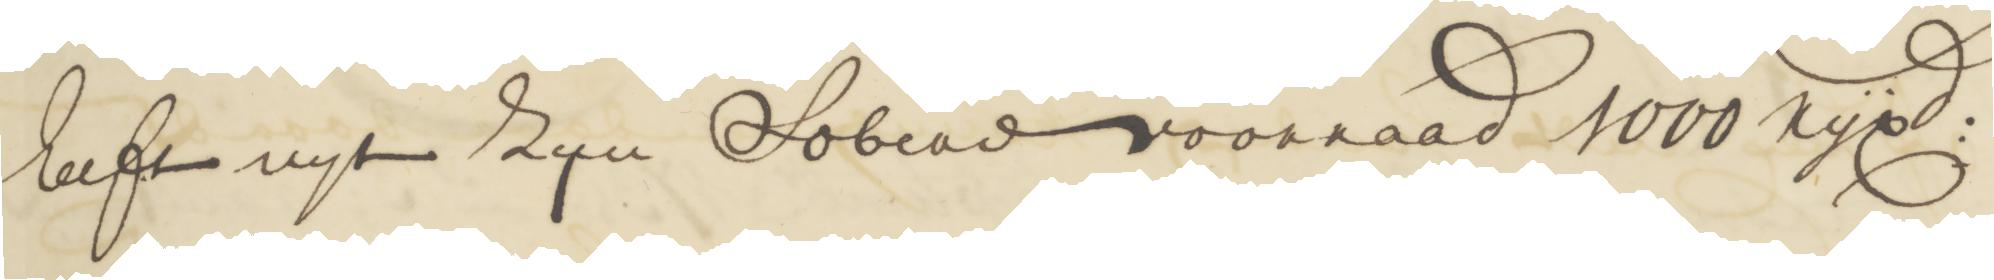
heeft uyt zyn sobere voorraad 1000 rijxd:
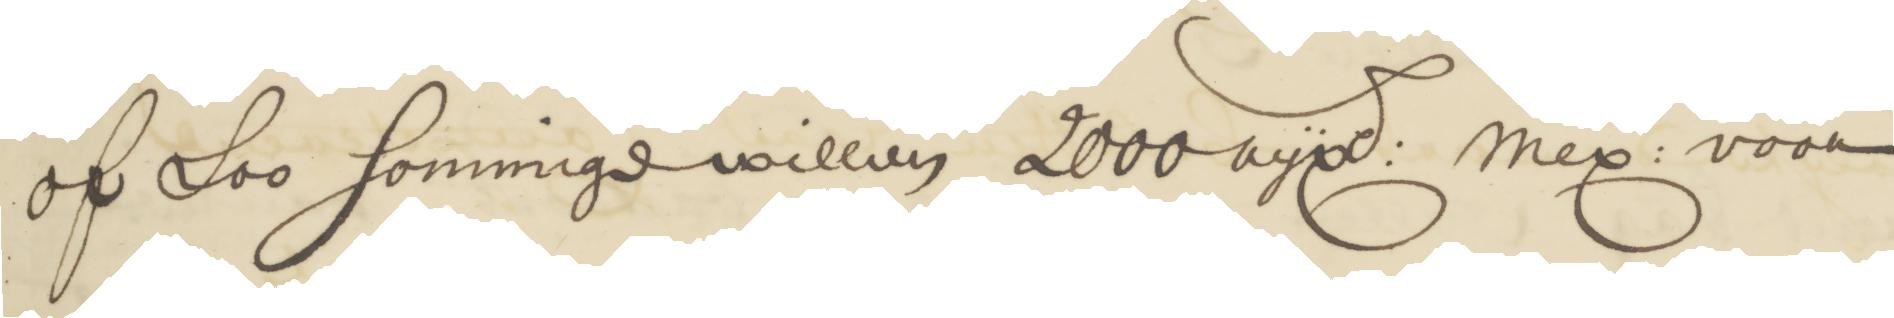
of Soo sommige willen 2000 rijxd: mex:s voor
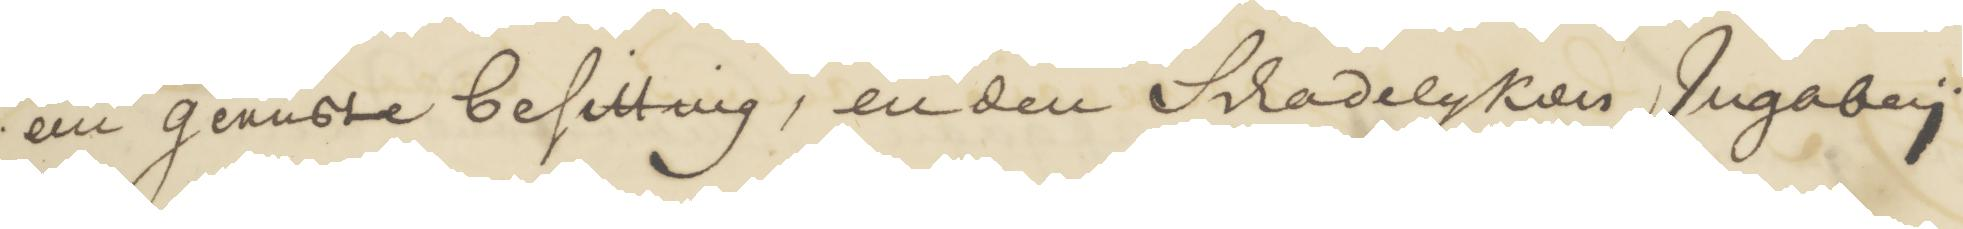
een geruste besitting, en den schadelijken Jngabeij
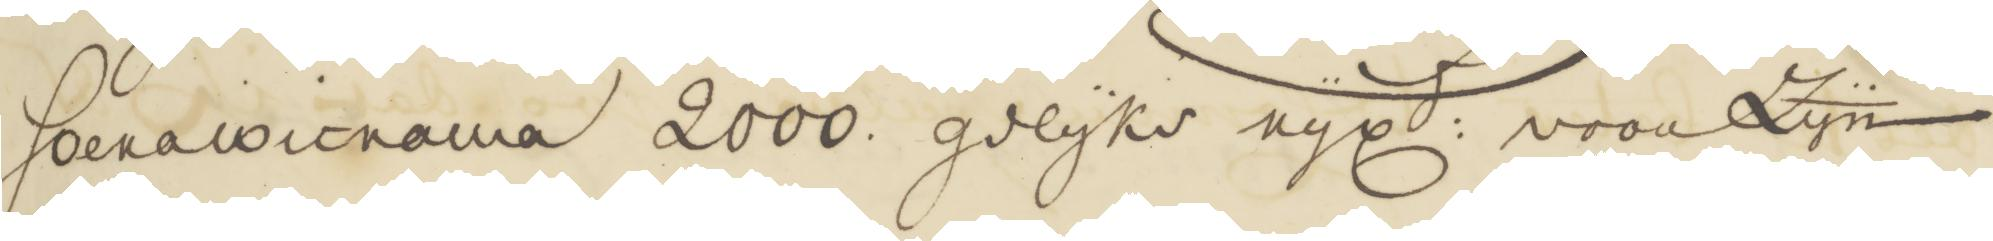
soerawicrama 2000. gelijke rijxt: voor Zijn
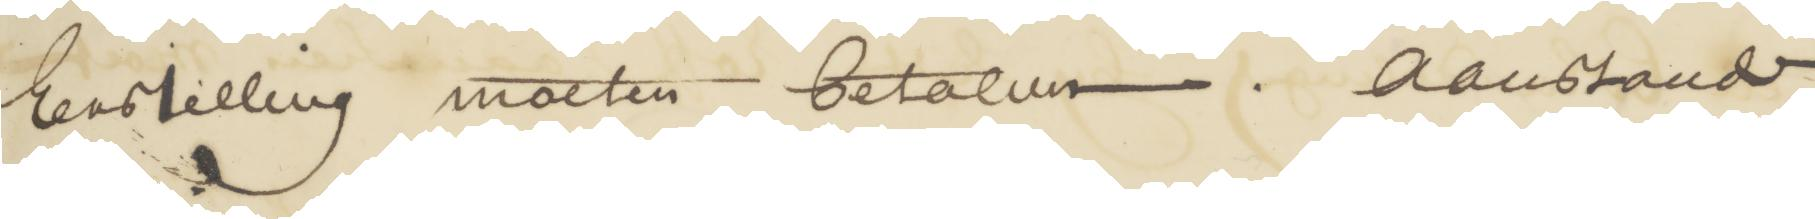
herstelling moeten betalen. aanstande
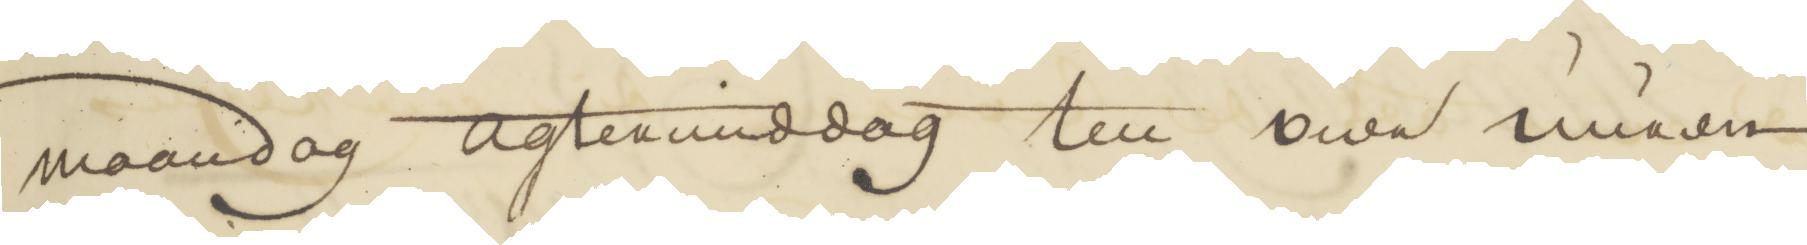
maandag agtermiddag ten vier uuren
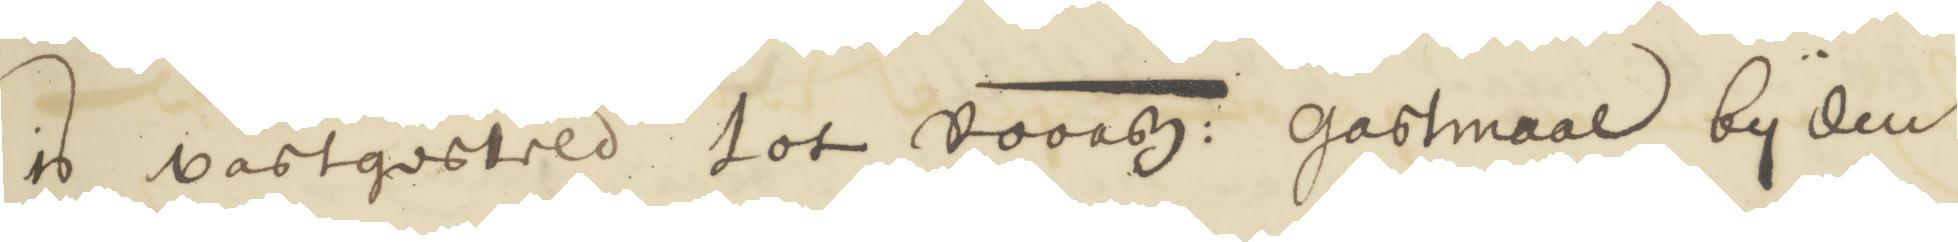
is vastgesteld tot voorsz: gastmaal bij den
